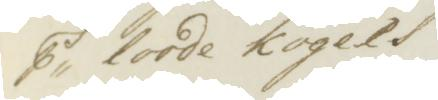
p„s loode kogels
